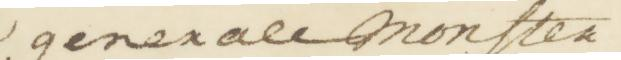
generale monster
